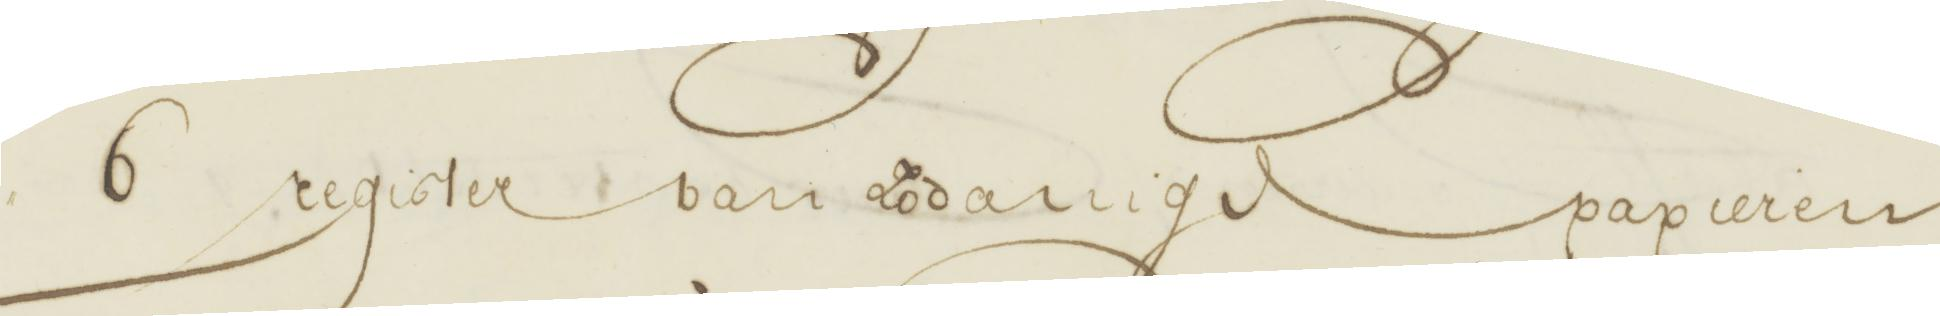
6 register van zodanige papieren
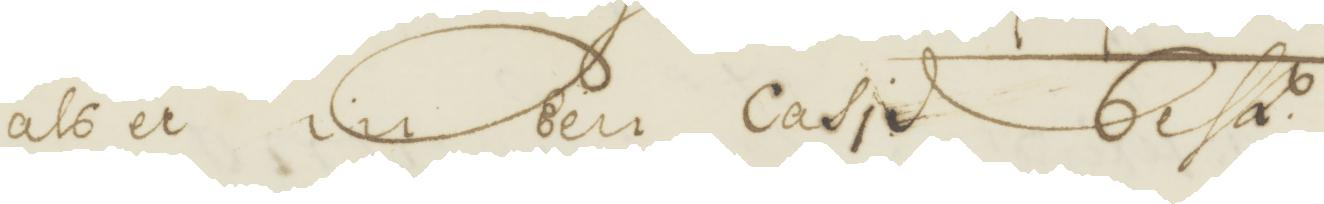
als 'er in den casie besz.
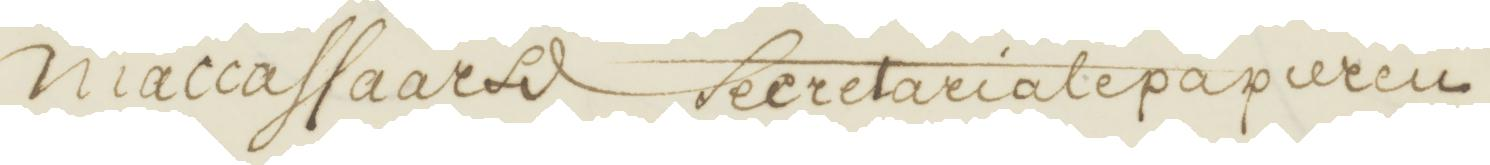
maccassaarse secretariale papieren
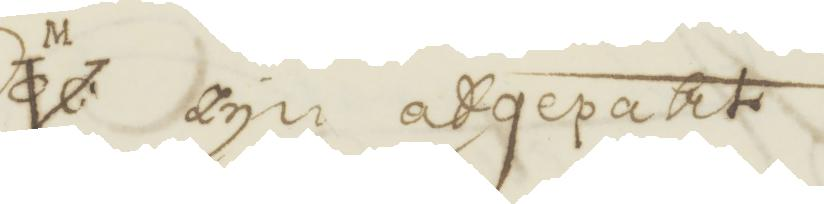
zijn afgepakt
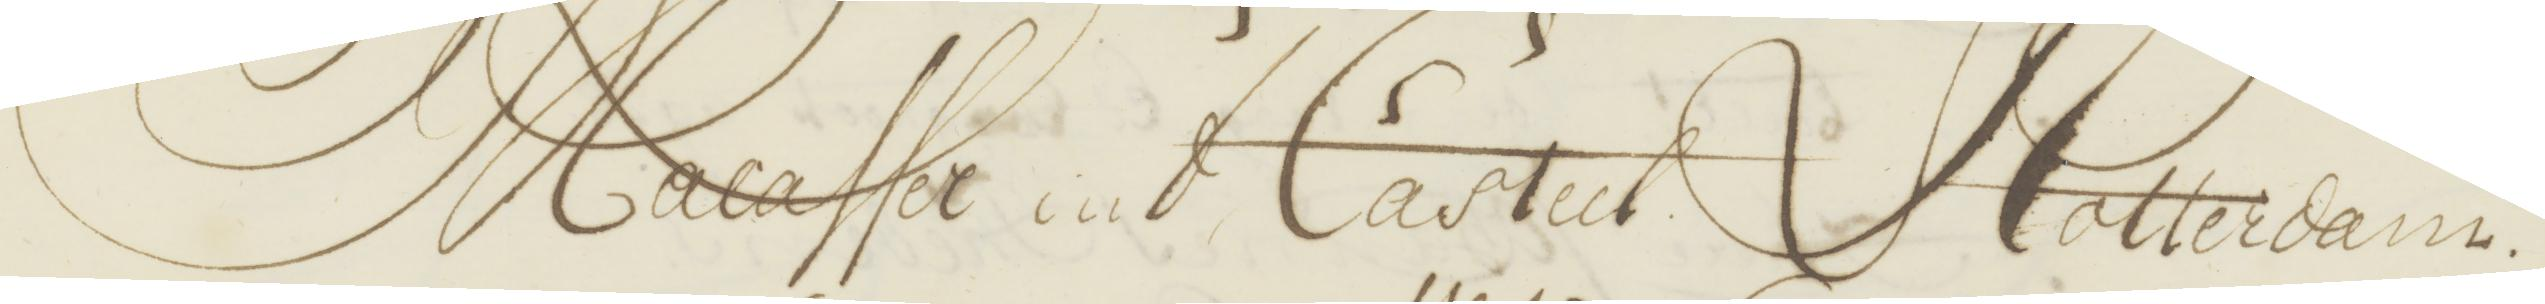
Macasser in 't Casteel Rotterdam.
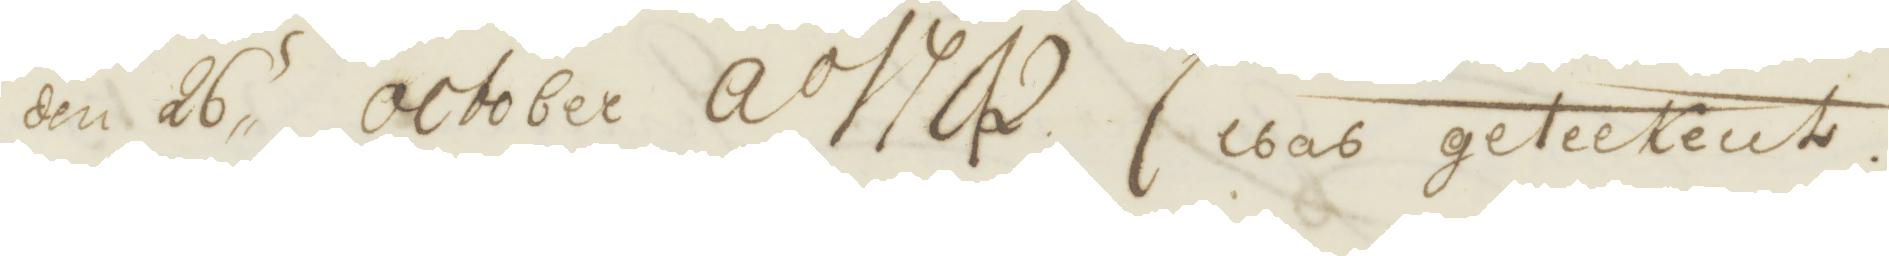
den 26„' october Ao 1742. (was geteekent.
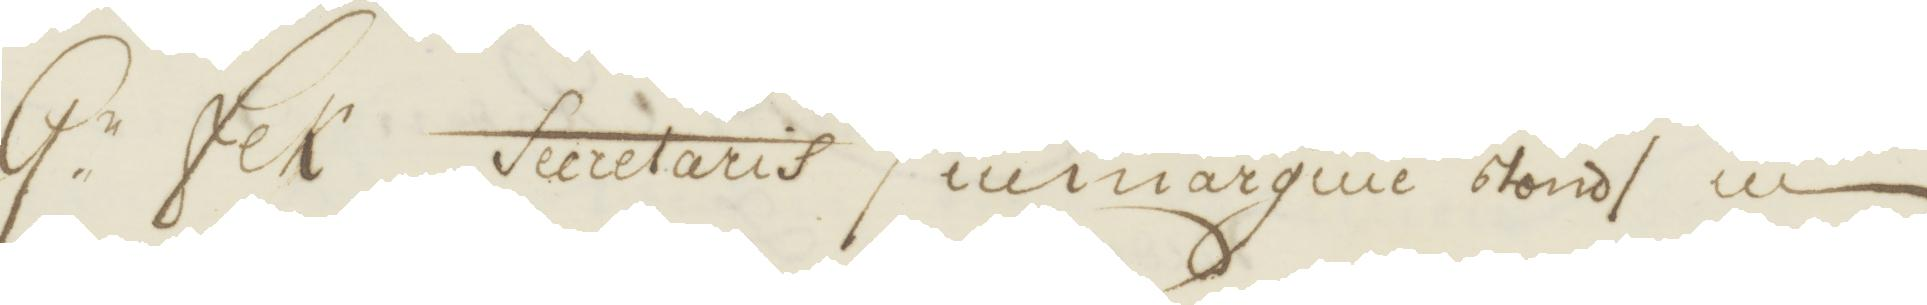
G:r Fek Secretaris /inmargine stond/ in
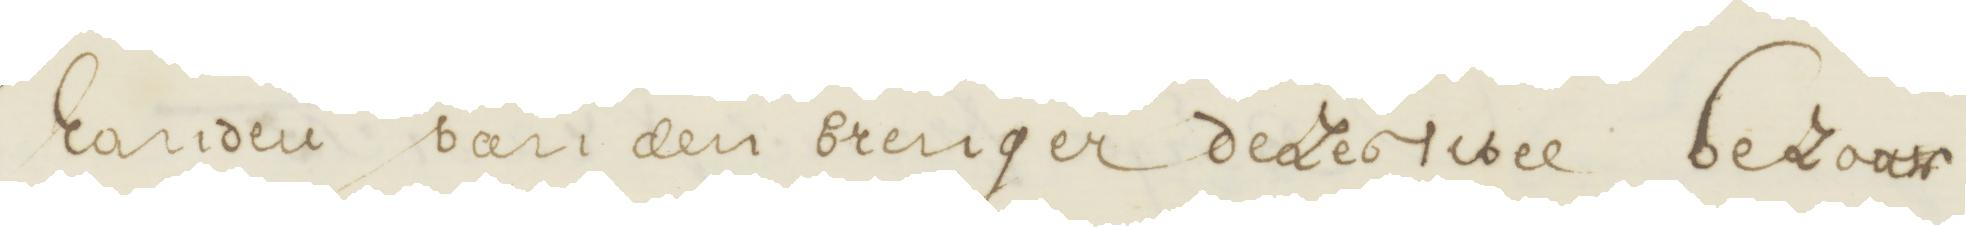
handen van den brenger dezes twee bezoor
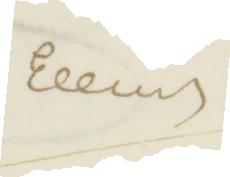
heemen
